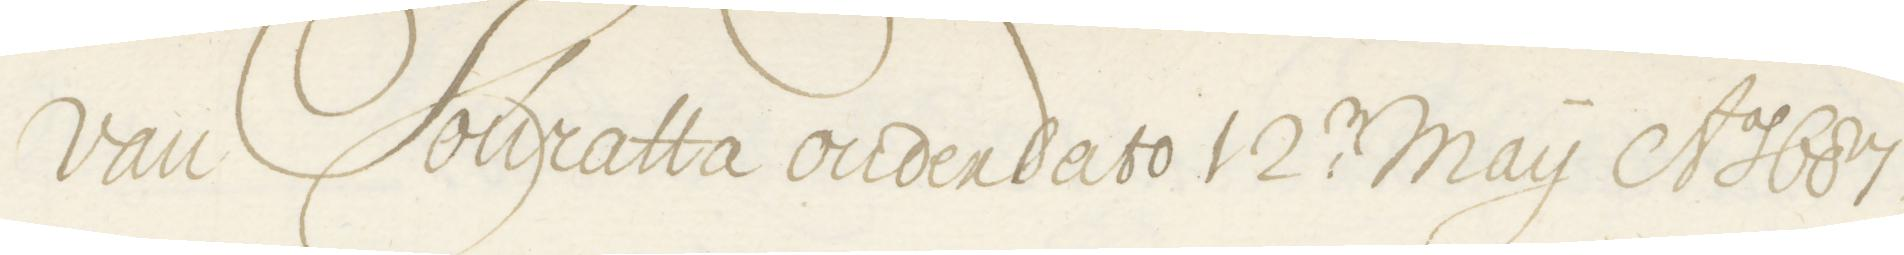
Van Souratta onder dato 12:en Maij Ao 1687
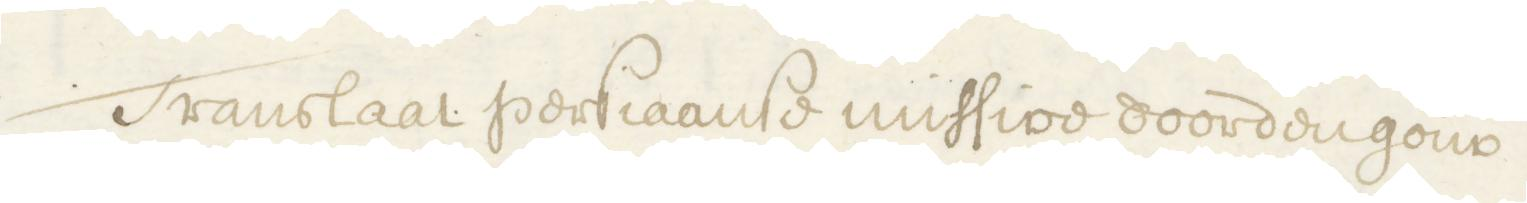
Translaat persiaanse missive door den gouvr
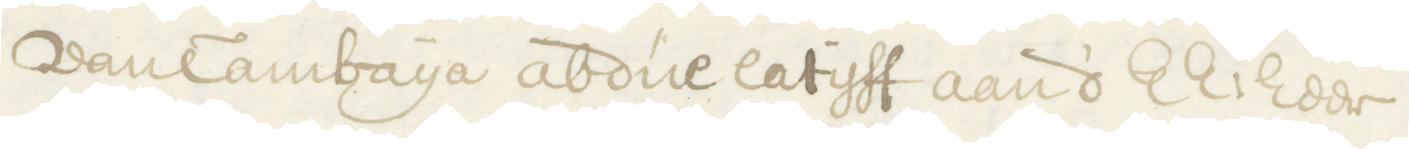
van Cambaija abdul latijff aan d’ EE: heer
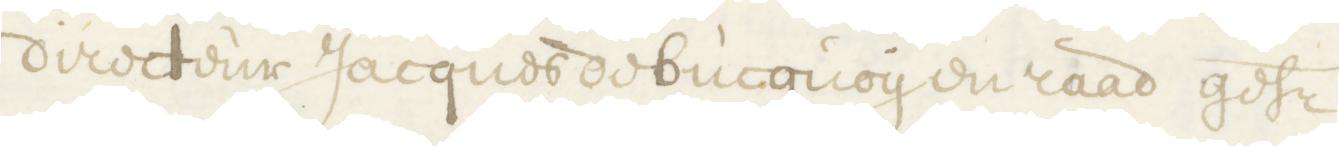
directeur Jacques debucquoij en raad gesz
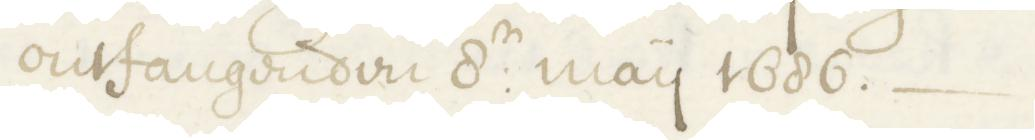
ontfangen den 8:' maij 1686. —
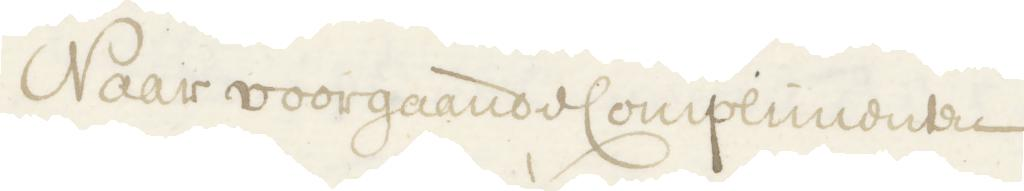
Naar voorgaande Complimenten
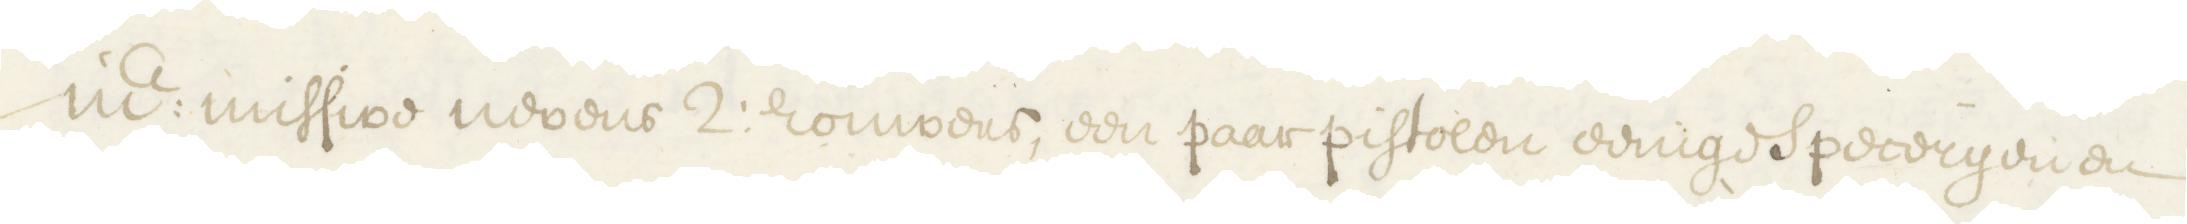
uE: missive nevens 2: houwers, een paar pistolen eenige specerijen en
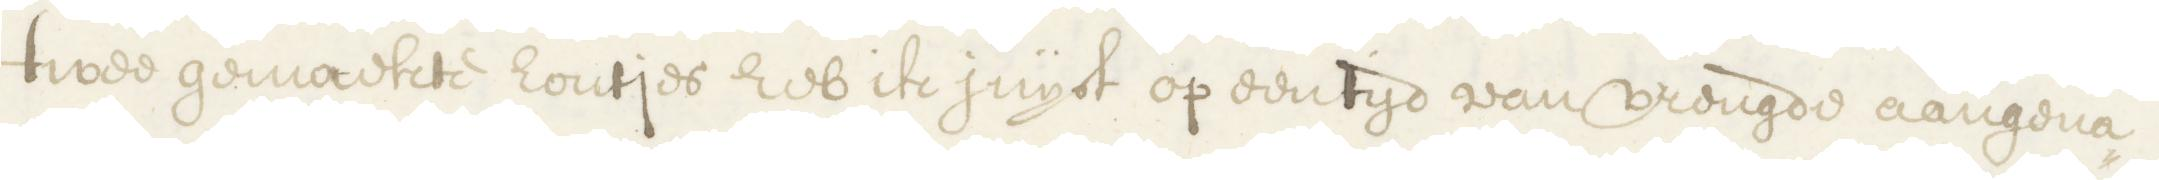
twee gemaekte houtjes heb ik juijst op een tijd van vreugde aangena„
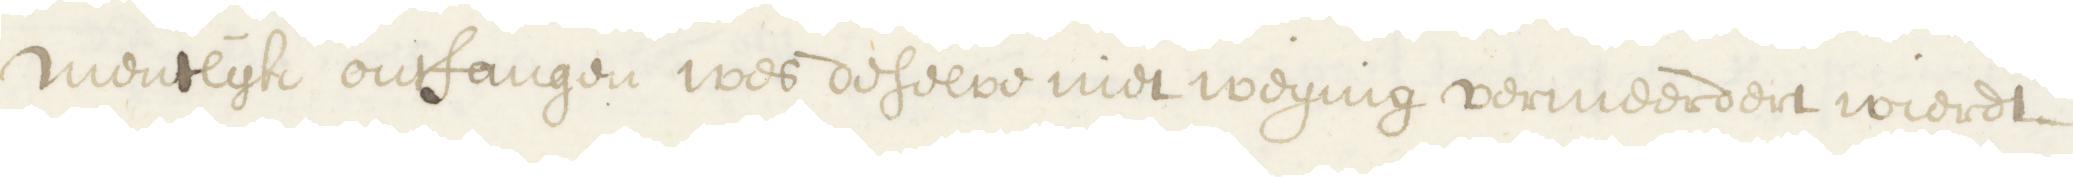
mentlijk ontfangen wes deselve niet weijnig vermeerdert wierdt
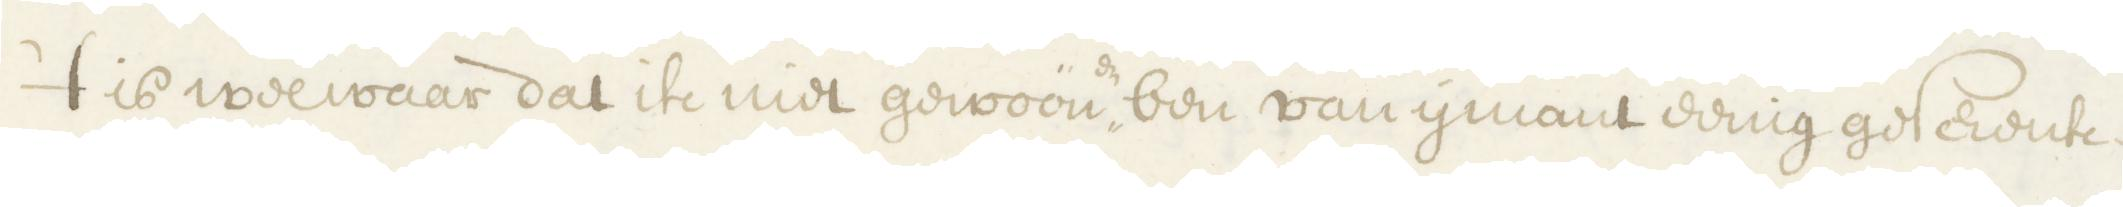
't is wel waar dat ik niet gewoon „ en ben van ijmant eenig geschenk
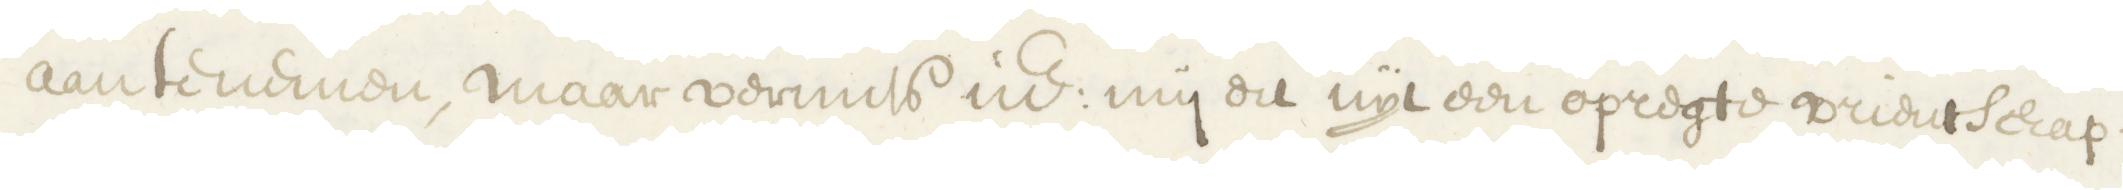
aan tenemen, maar vermits uE: mij dit uijt een opregte vrientschap
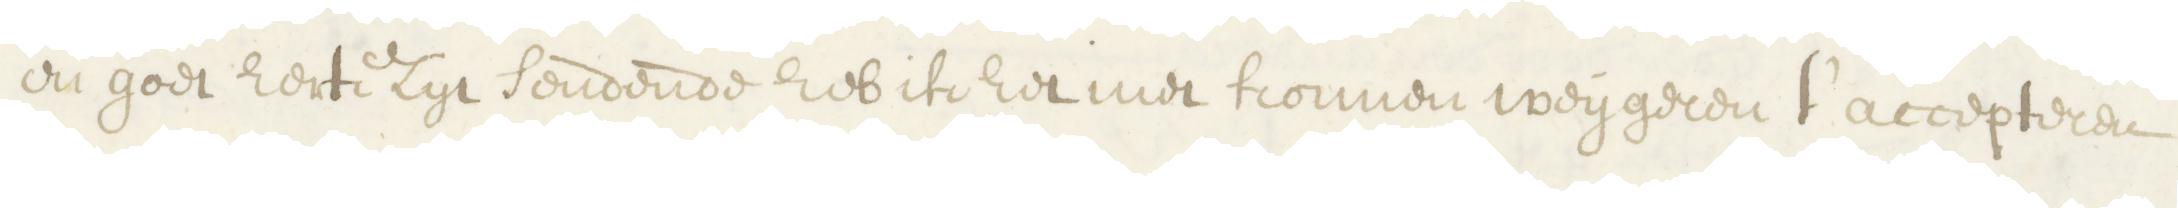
en goet hert zijt sendende heb ik het niet konnen weijgeren t'accepteren
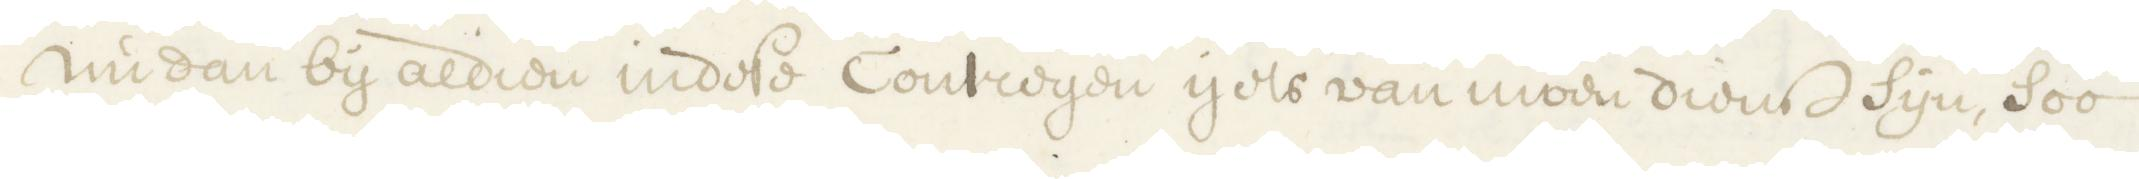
nu dan bij aldien indese Contreijen ijets van uwen dienst sijn, soo
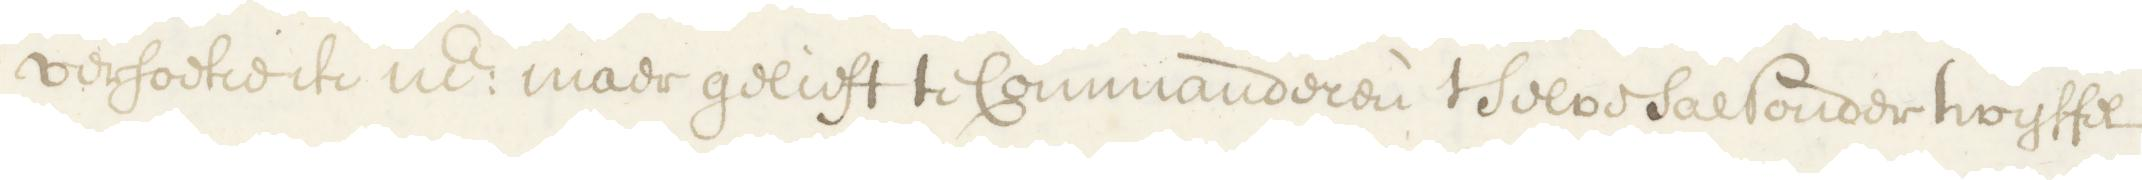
versoeke ik uE: maer gelieft te Commanderen 't selve salsonder twijffel
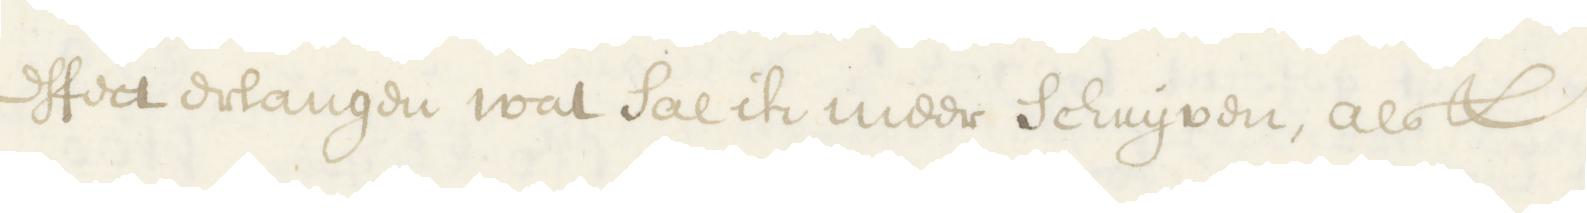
Effect erlangen wat sal ik meer schrijven, als
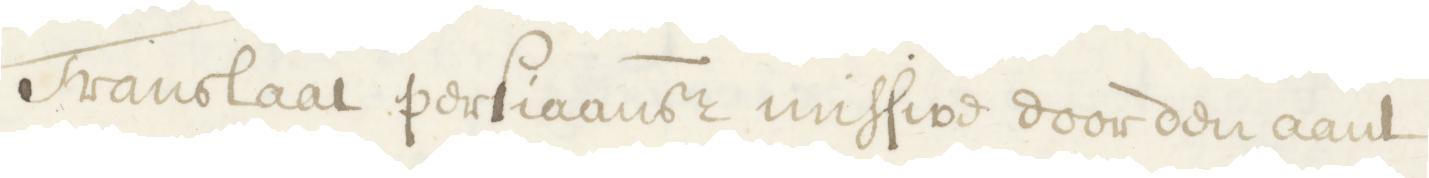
Translaat persiaansz missive door den aan't
